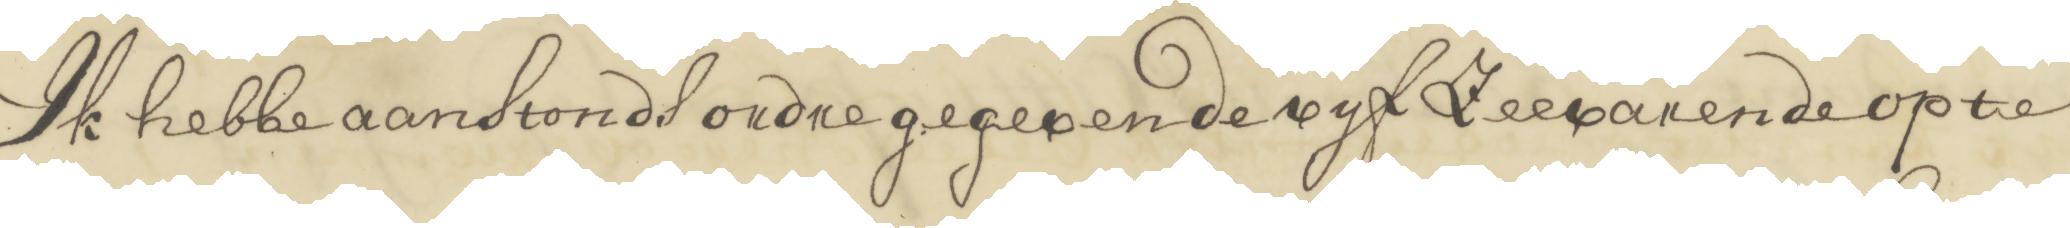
Ik hebbe aanstonds ordre gegevende vijf Zeevarende op te
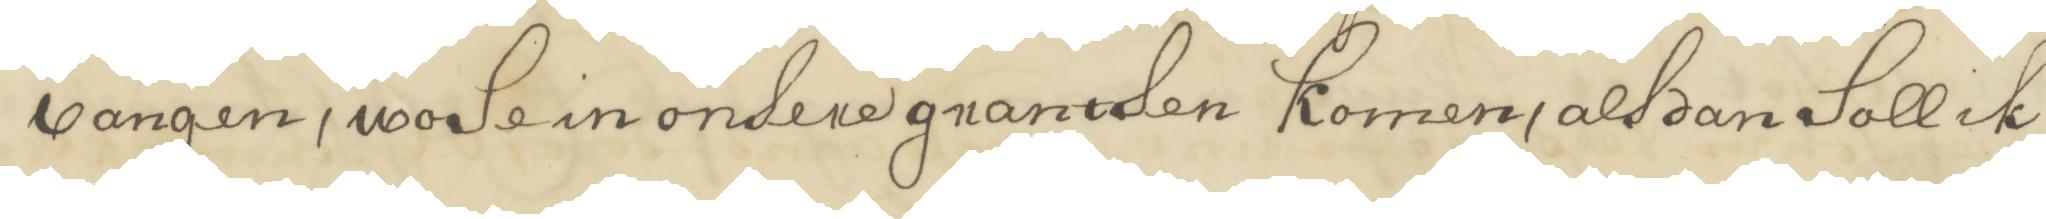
vangen, wo Se in onsere grantsen komen, als dan Soll ik
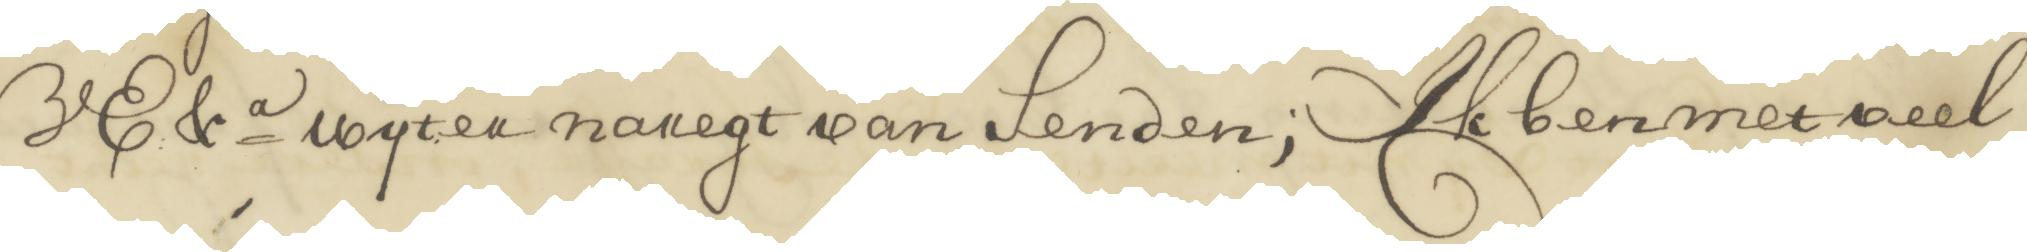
VE &=a wijter naregt van Senden; Ik ben met veel
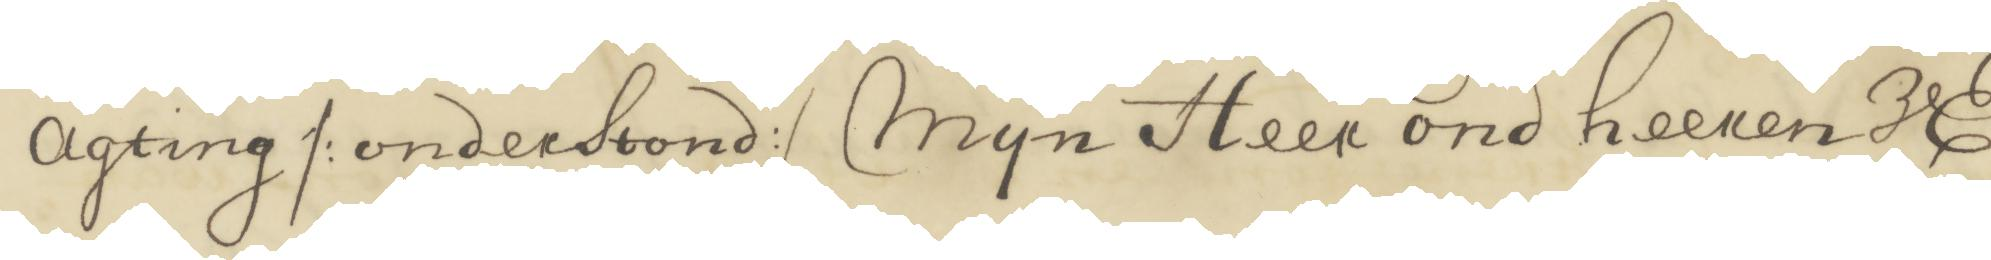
agting /: onderstond:/ Mijn Heer ond heeren VE
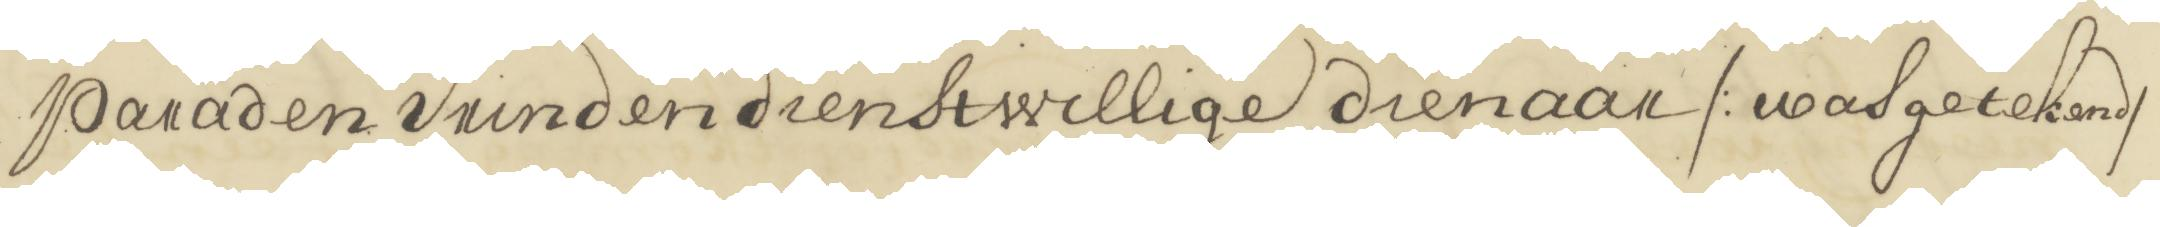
paraden vrinden dienstwillige dienaar /: was getekend/
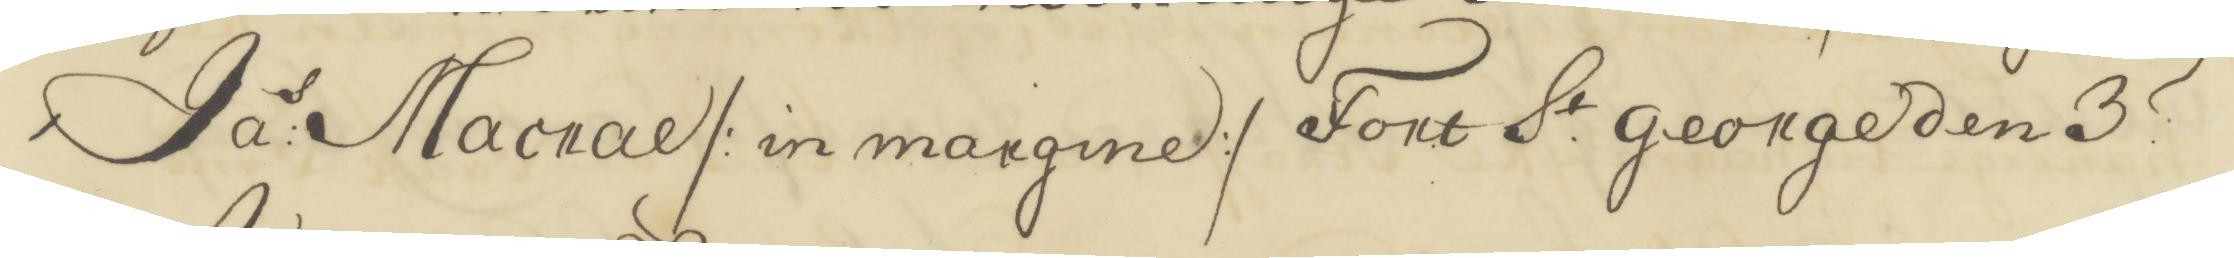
,Ja:s Macrae /: in margine:/ Fort S.t george den 3:'
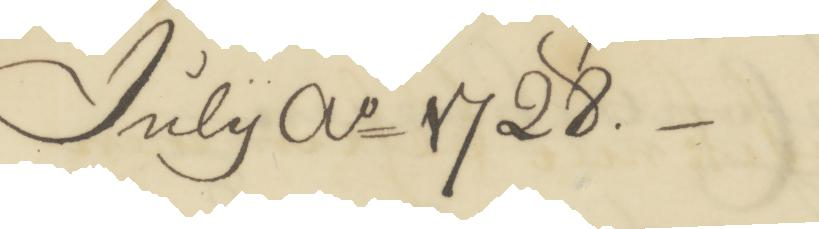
Iulij A=o 1728.—
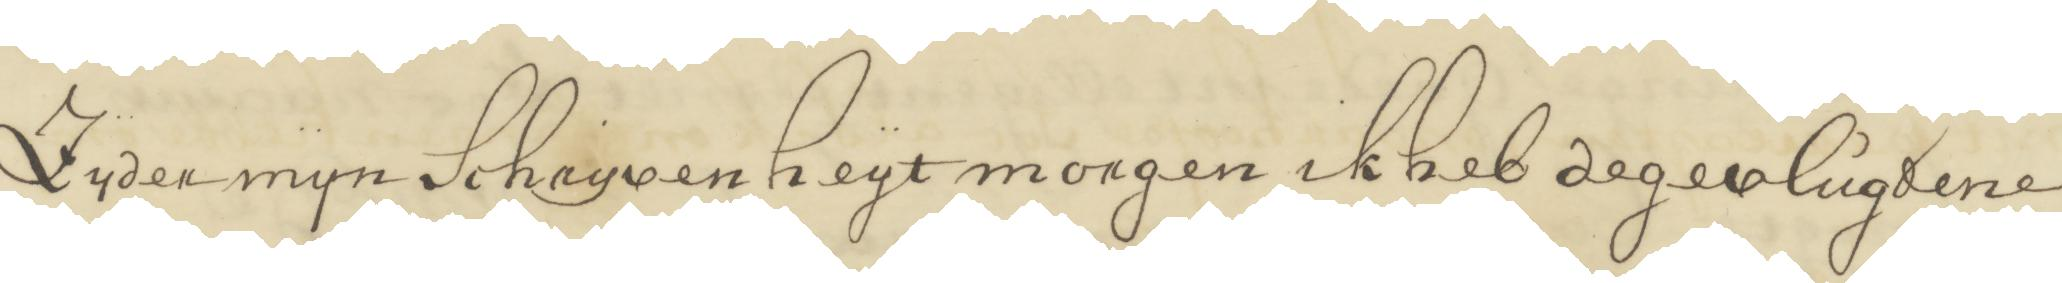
Zijder mijn Schryven heijt morgen ik heb de gevlugtene
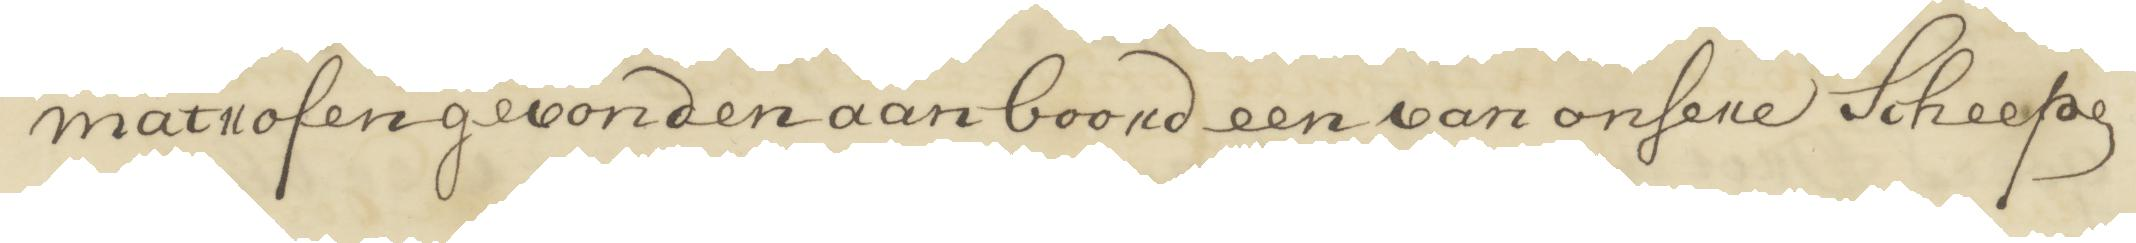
matrosen gevonden aan boord een van onsere Scheepen
